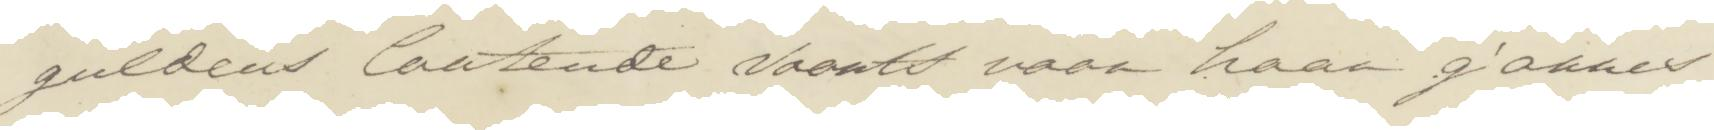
guldens laatende voorts voor haar g'arres
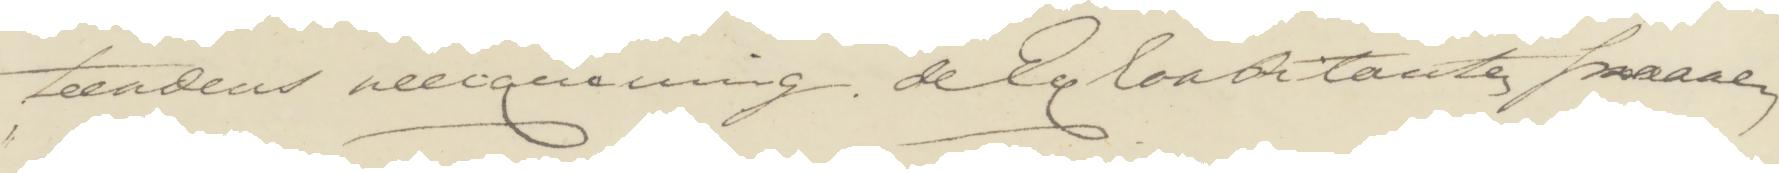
„teerdens reecquening. de Exhorbitanten swaaren
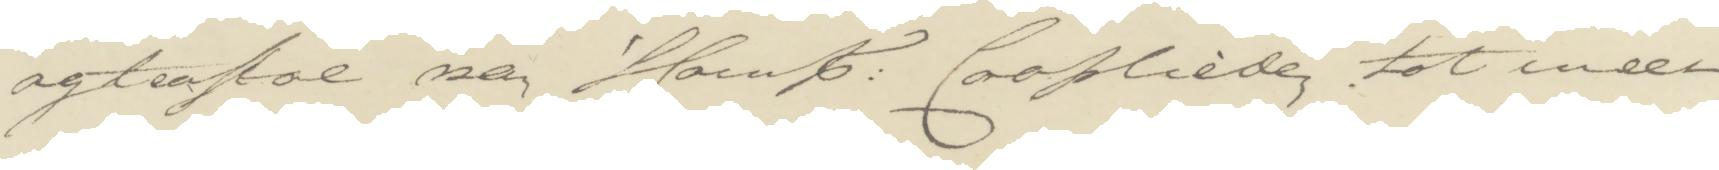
agterstal van 'sComp: Cooplieden tot meer
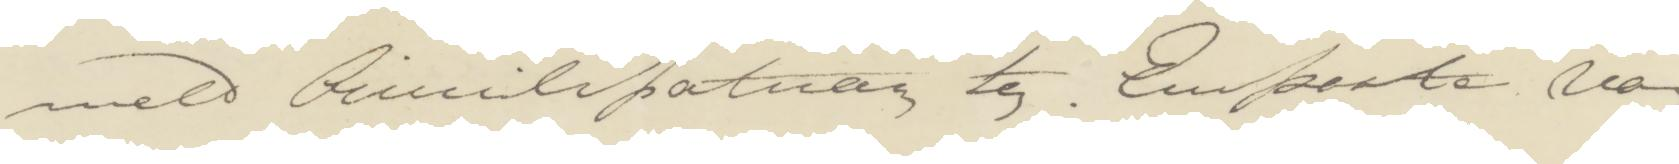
meld bimilipatnam ten. Emporte van
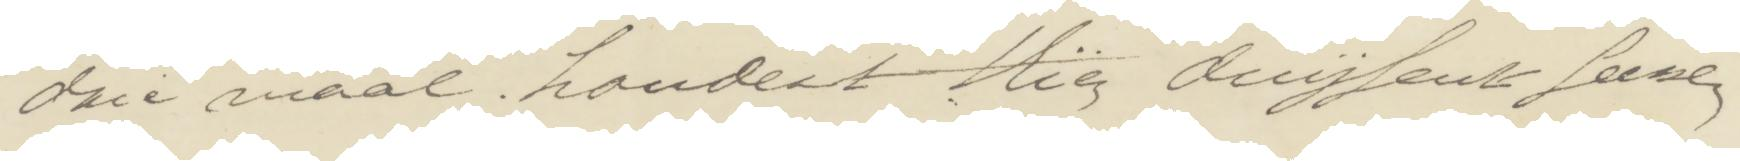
drie maal . hondert thien duijsent seeven
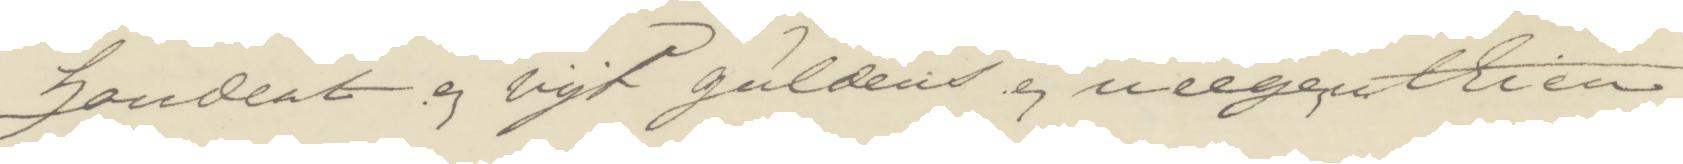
hondert en vijf guldens en neegenthien
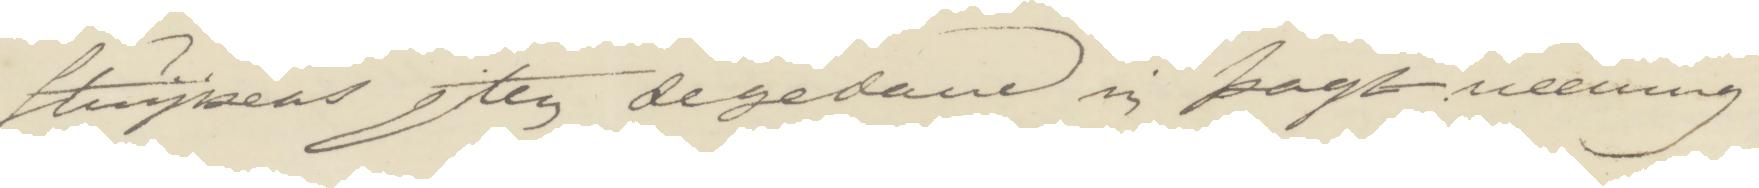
stuijvers jtem de gedane in pagt neeming
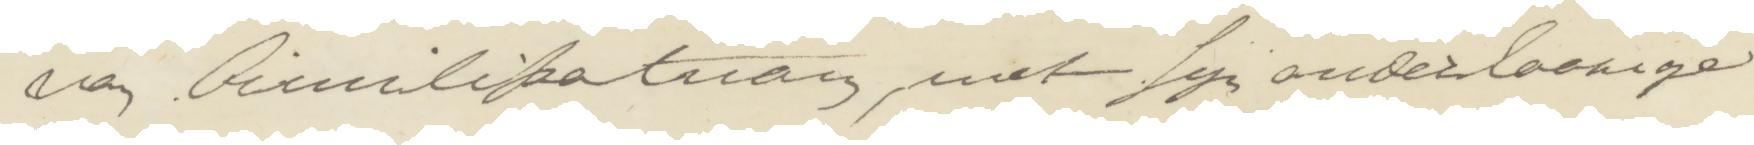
van bimilipatnam, met sijn onderhoorige
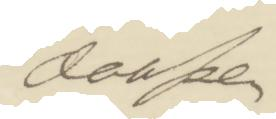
dorpen
